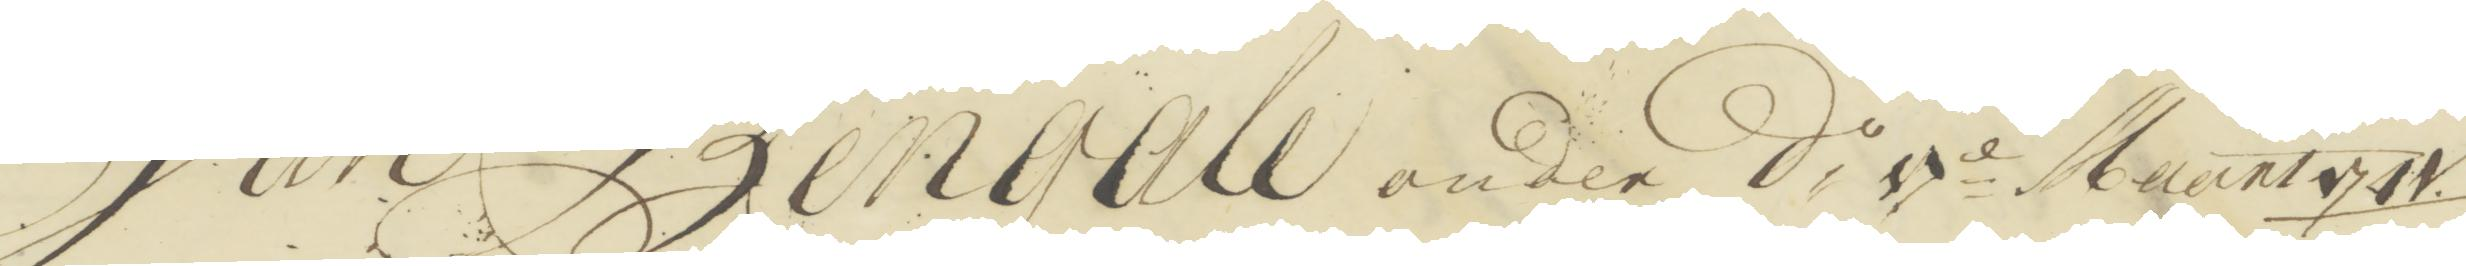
Van Bengale onder d„o 17=e Maart 1741.
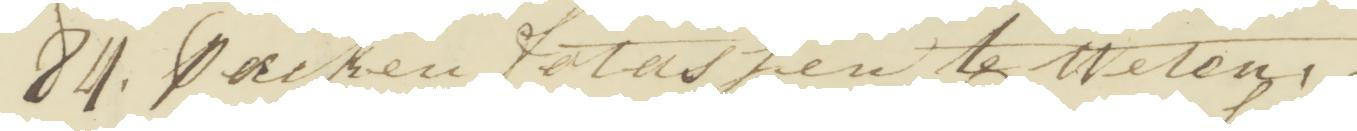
84. packen fotassen te weten
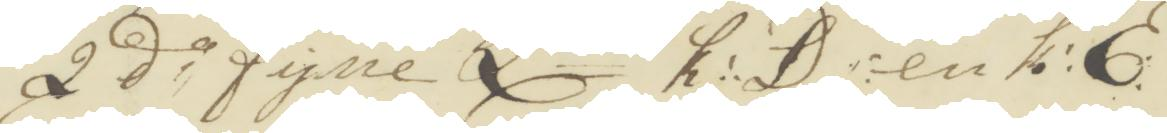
2 d„o fijne L=ra k: D: en k: E:
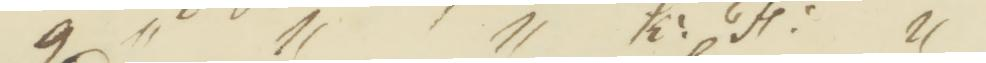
9 „ „ „ k: F: „
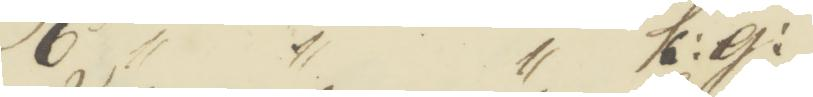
6 „ „ „ k: g:
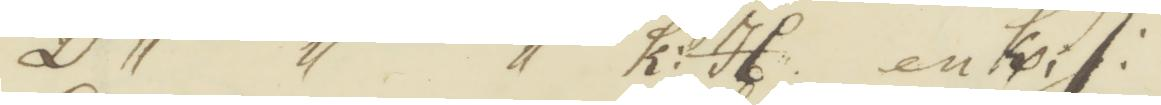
2 „ „ „ k: H: en k: J:
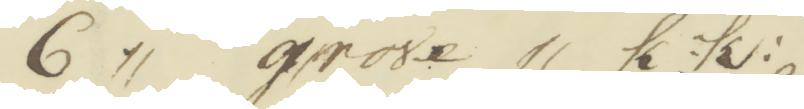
6 „ grove „ k: k:
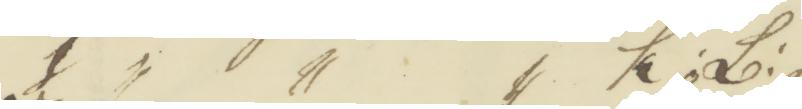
1 „ „ „ k: L:
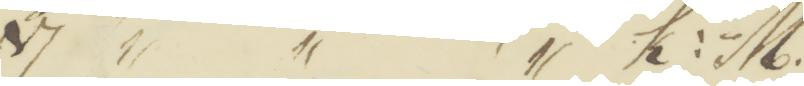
17 „ „ „ k: M:
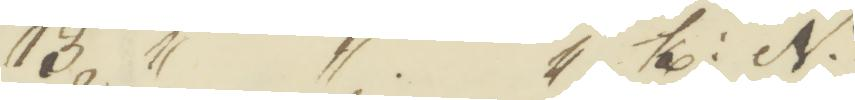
13 „ „ „ k: N:
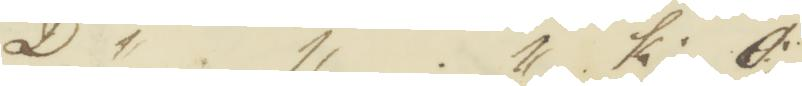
2 „ „ „ k: O:
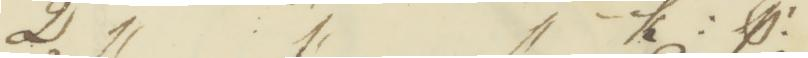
2 „ „ „ k: P:
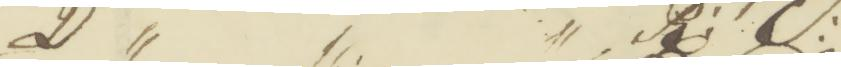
2 „ „ „ R: C:
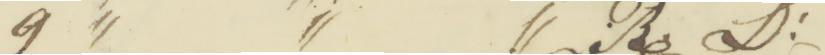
9 „ „ „ R: D:
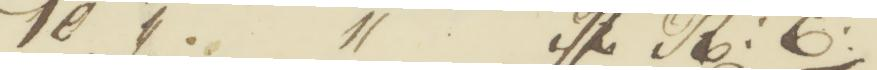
10 „ „ „ R: E:
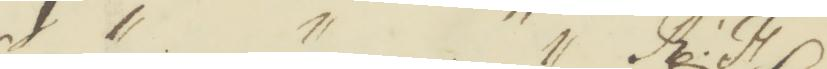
1 „ „ „ R: F:
